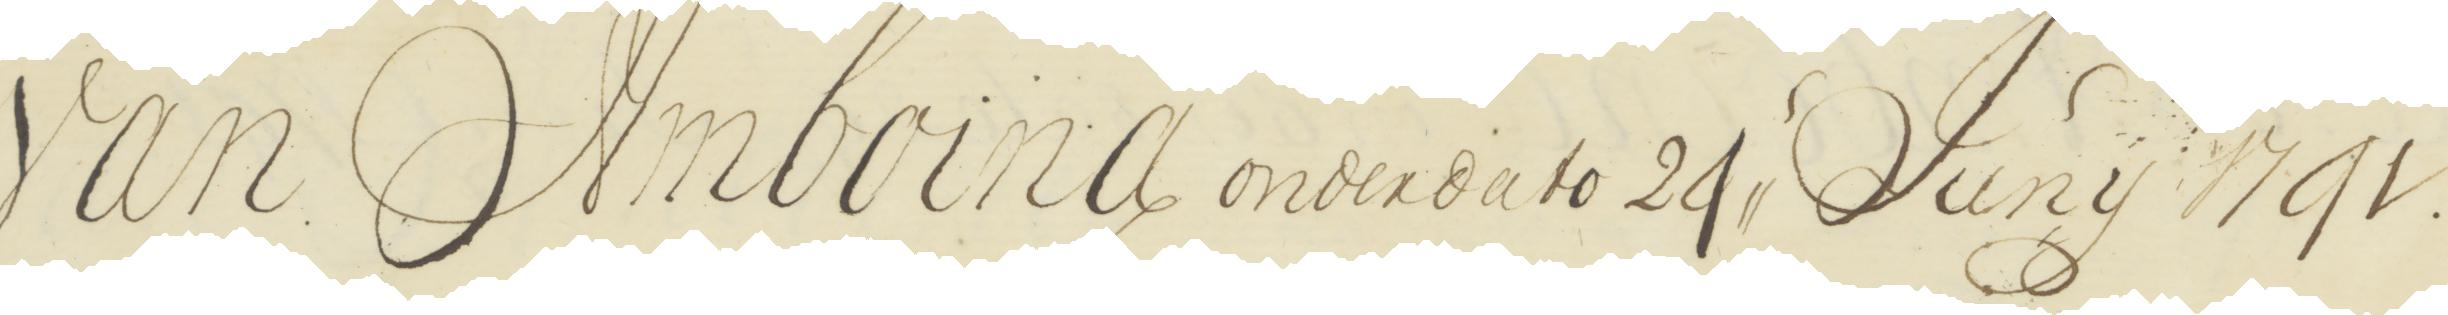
Van Amboina onder dato 24„' Iunij 1741.
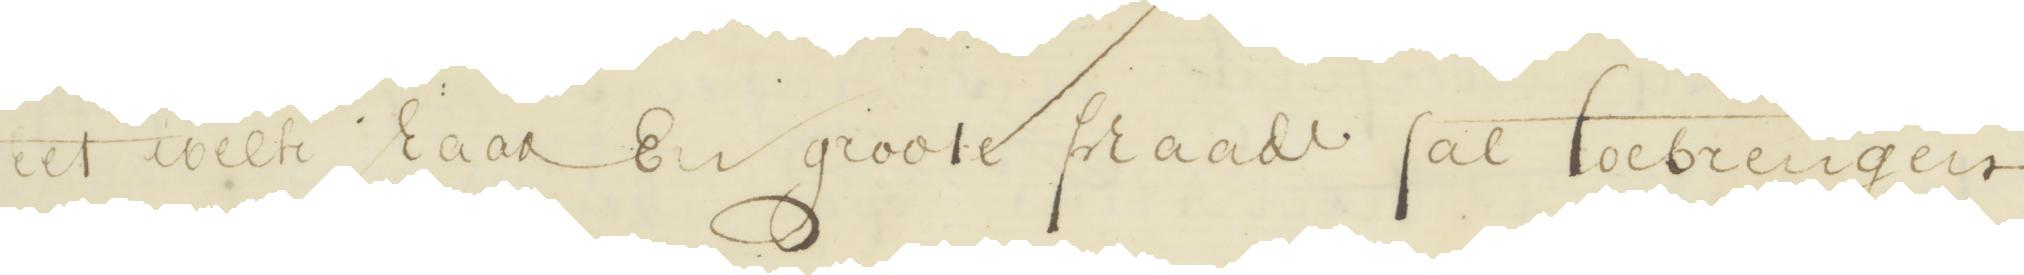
het welk haar En groote schaade sal toebrengen
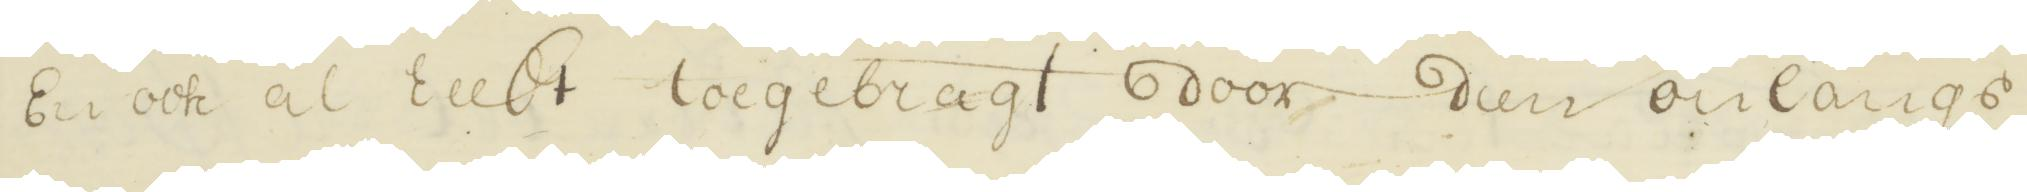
En ook al heeft toegebragt door dien onlangs
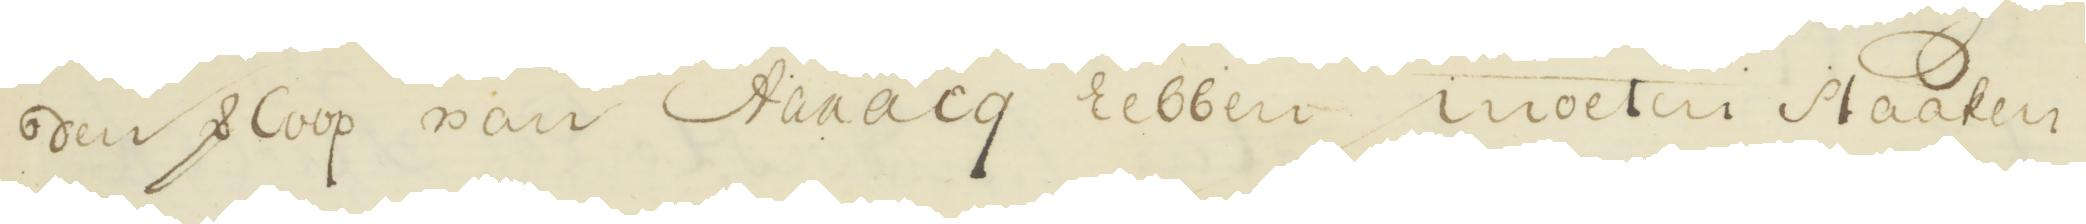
den vercoop van Aaracq hebben moeten staaken
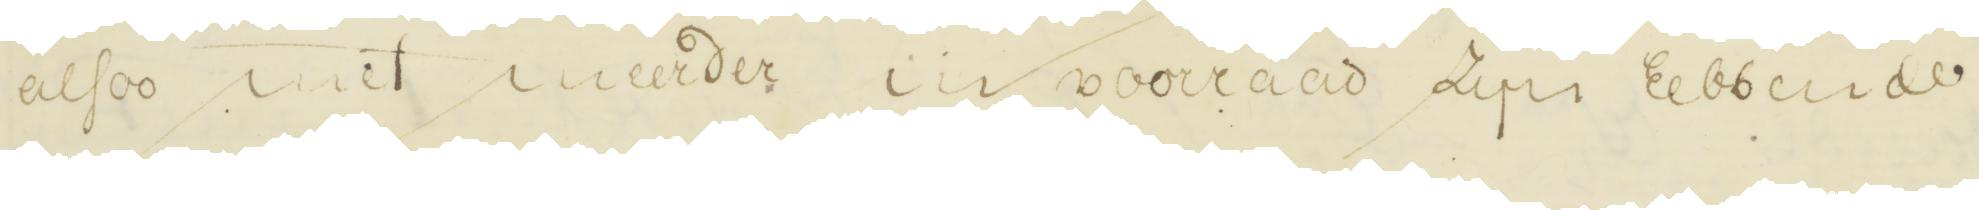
alsoo met meerder in voorraad zyn hebbende
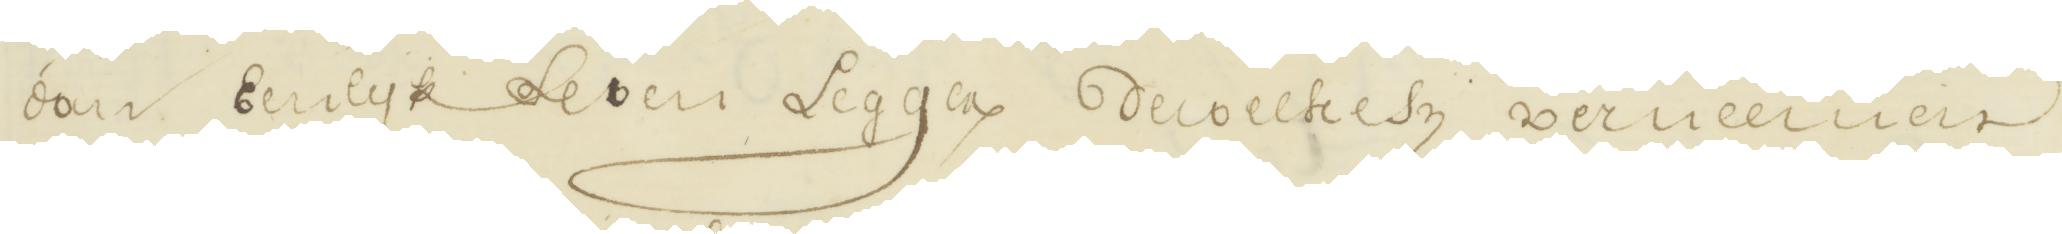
dan Eenlyk leven legger dewelke sy verneemen
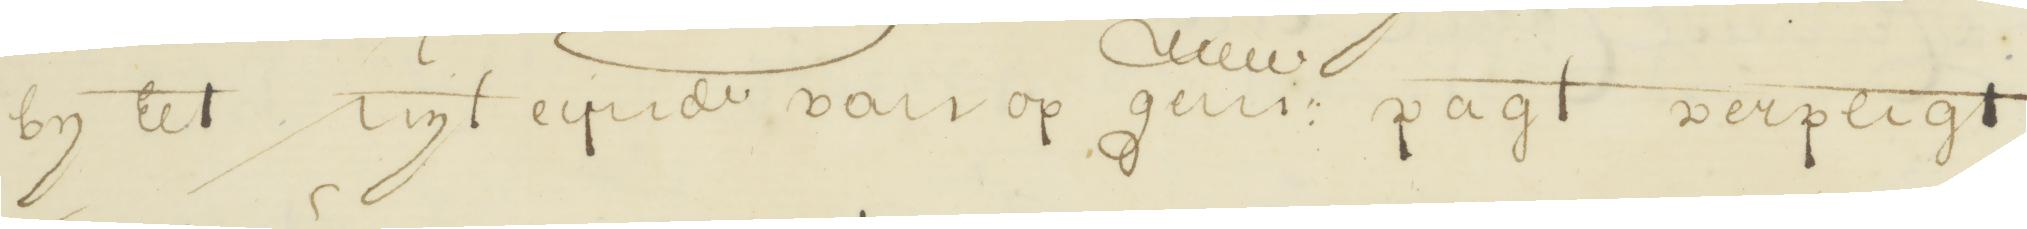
by het uyt eynde van op gem: pagt verpligt
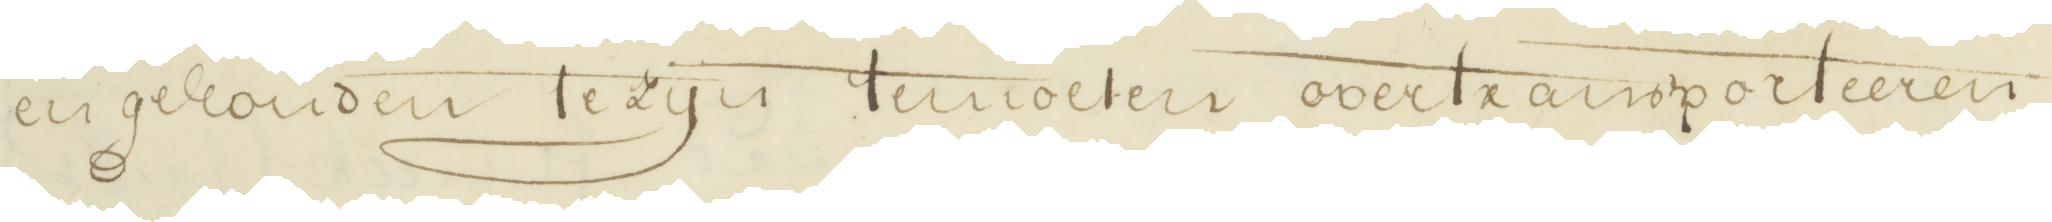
en gehouden te zijn temoeten over transporteeren
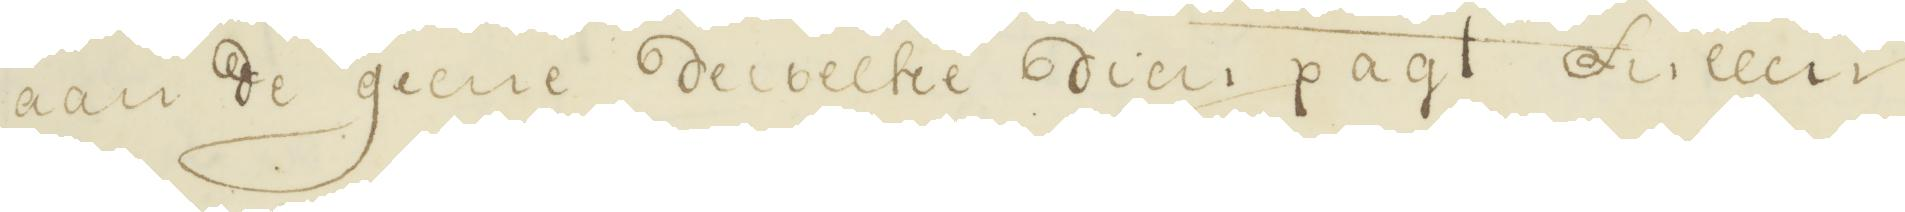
aan de geene dewelke dien pagt sullen
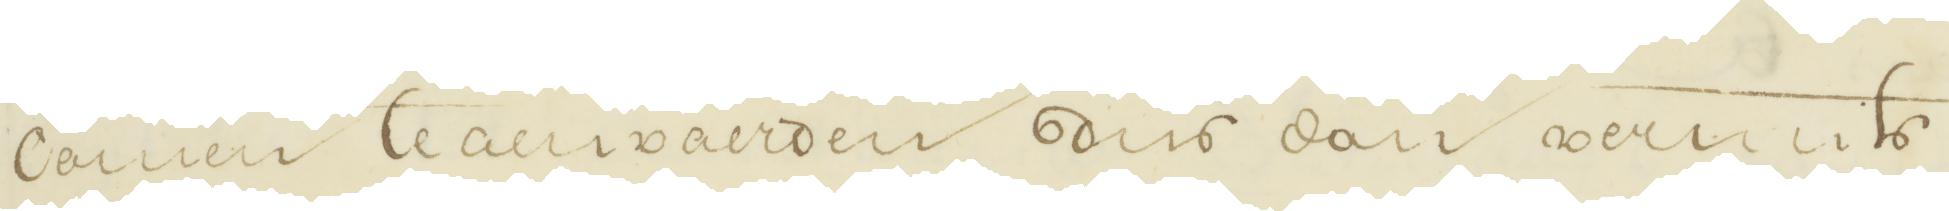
comen te aenvaerden dus dan vermits
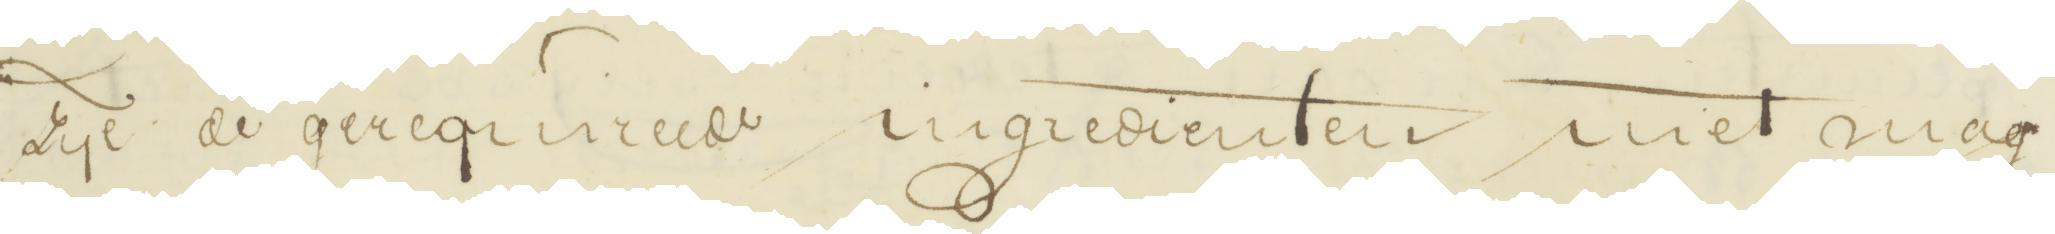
zyl de gerequireede ingredienten niet mag
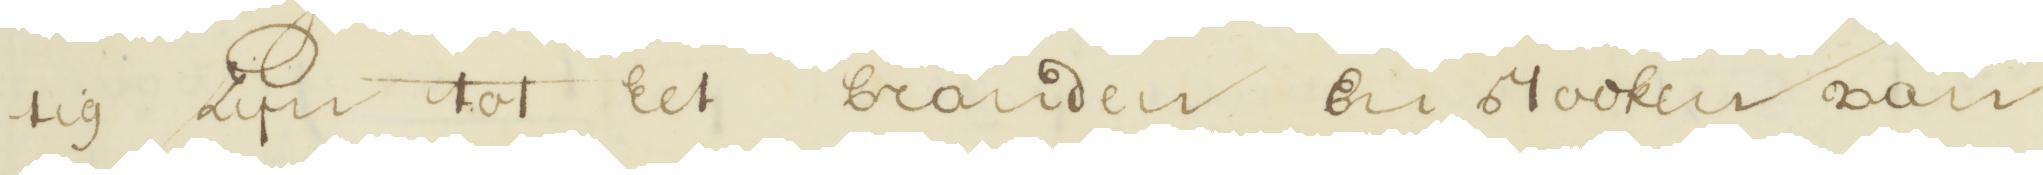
tig zyn tot het branden en stooken van
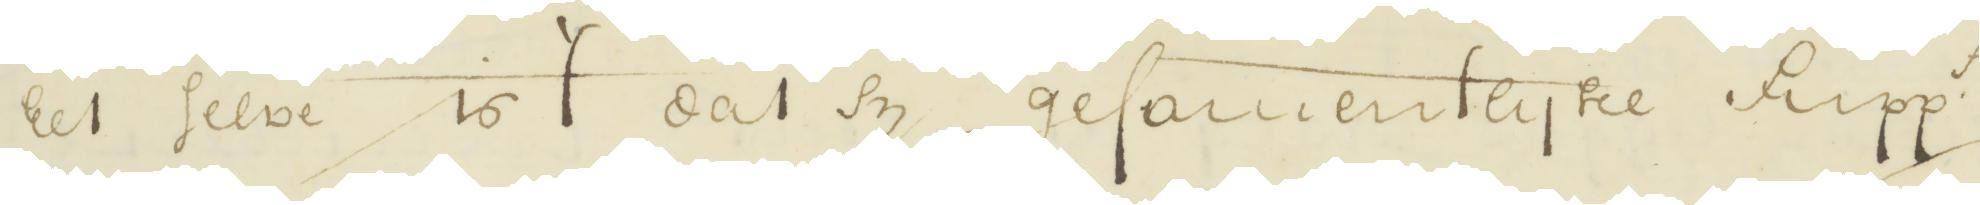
het selve is 't dat sy gesamentlyke supp:s
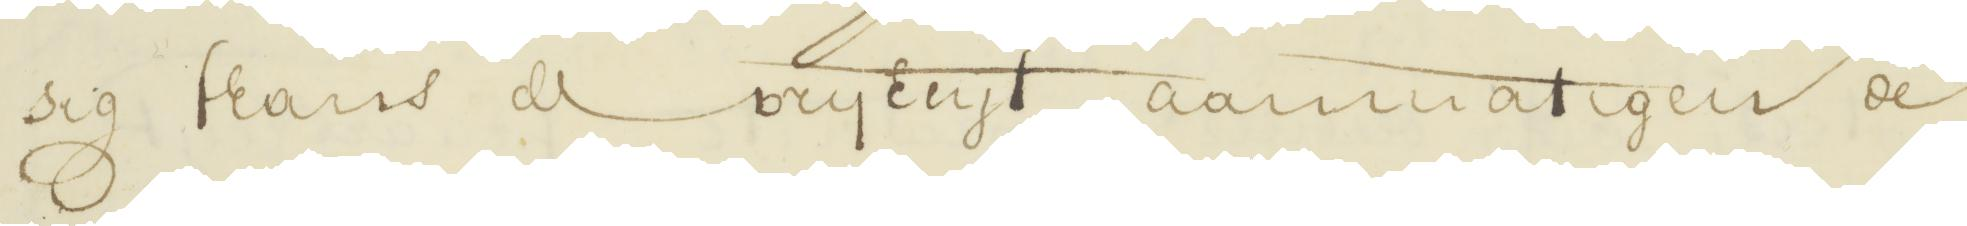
sig thans de vryheyt aanmatigen de
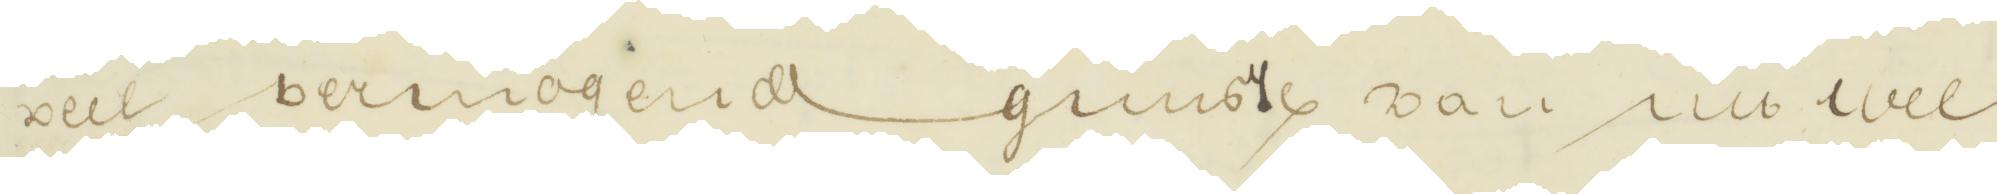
veel vermogende gunste van uw wel
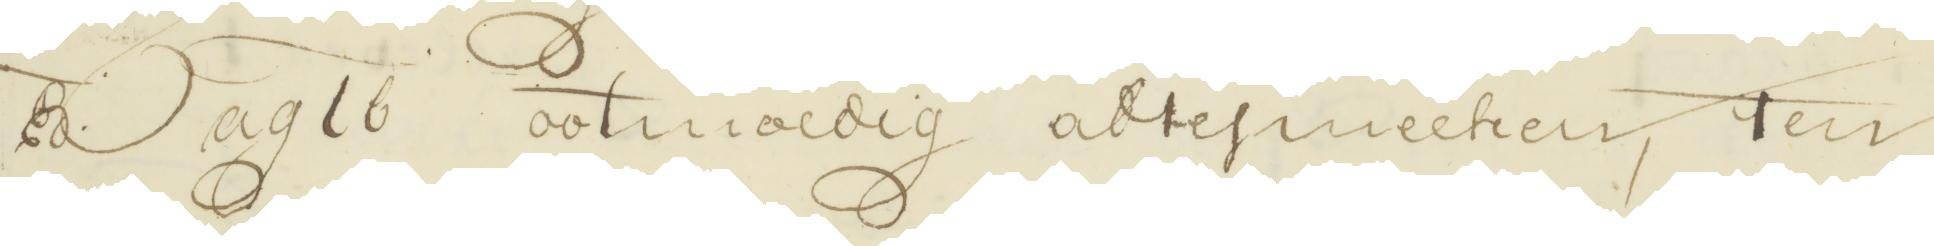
Ed: agtb ootmoedig aftesmeeken, ten
